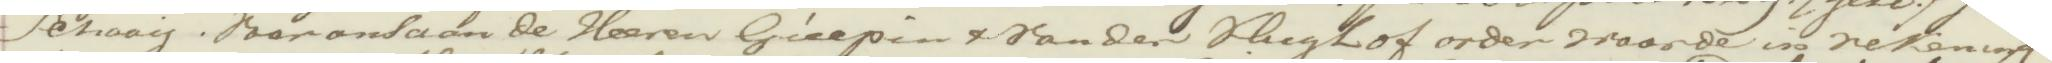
Schaaij, Voor ons aan de Heeren Guépin & van den Vlugt of order waarde in rekening
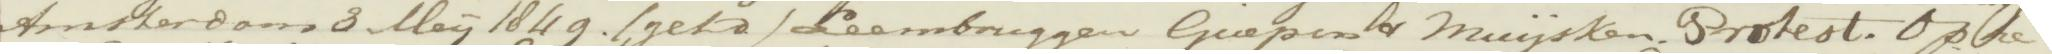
Amsterdam 3 Meij 1849. (getd) Leembruggen Guepin & Muijsken. Protest. Op he
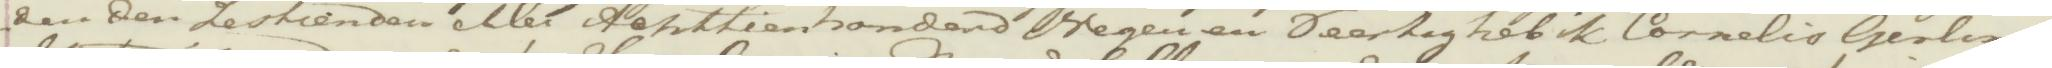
„den den Zestienden Mei Achttienhonderd Negen en Veertig heb ik Cornelis Gerlings
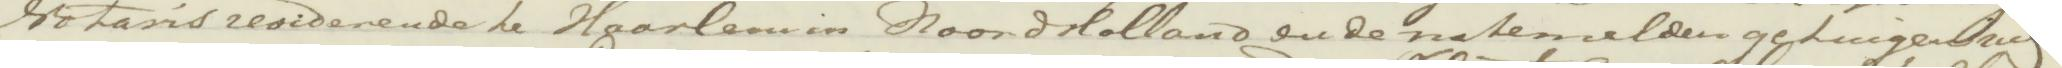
Notaris residerende te Haarlem in Noord Holland, en de natemelden getuigen uit
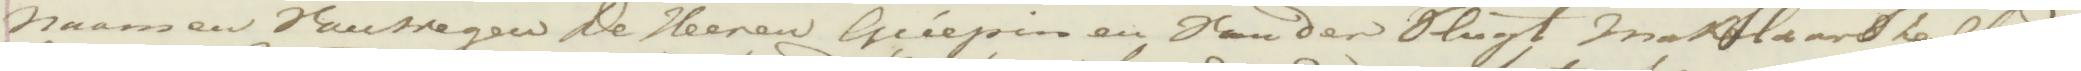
Naam en Vanwegen De Heeren Guépin en Van der Vlugt Makelaars te Haar
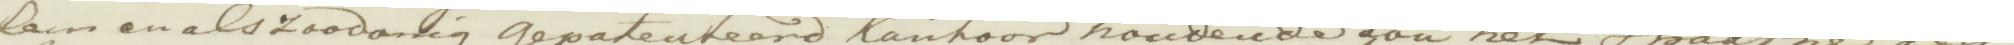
lem en als zoodanig gepatenteerd kantoor houdende aan het spaarne als
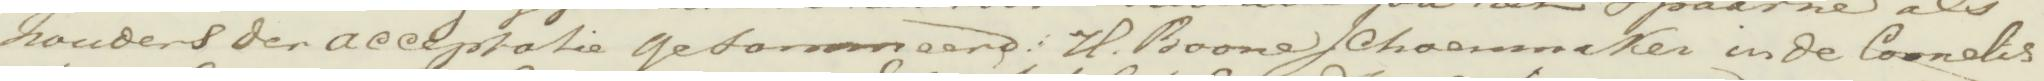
houders der acceptatie gesommeerd: H. Boone Schoenmaker in de Cornelis
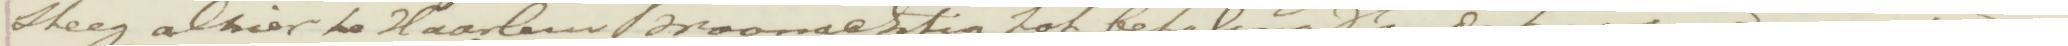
steeg alhier te Haarlem woonachtig tot betaling Van de hiervoor gecopieerde
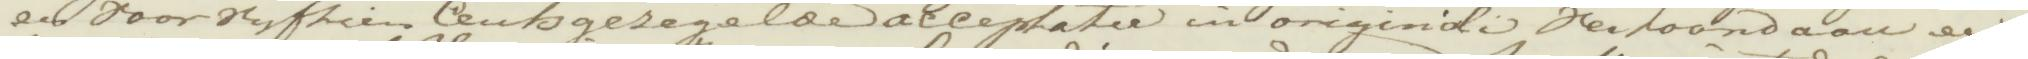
en Voor vyftien Cents gezegelde acceptatie in originali vertoond aan en
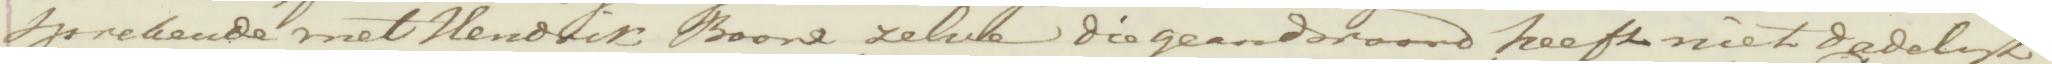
sprekende met Hendrik Boone zelve die geandwoord heeft niet dadelyk
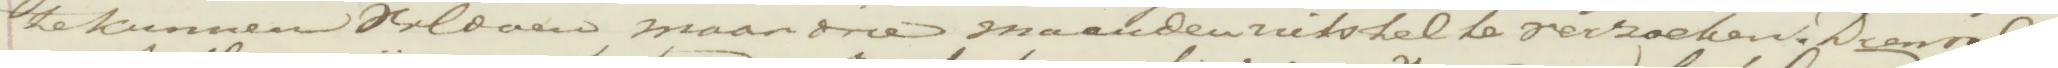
te kunnen Voldoen maar drie maanden uitstel te verzoeken. Dienvol.
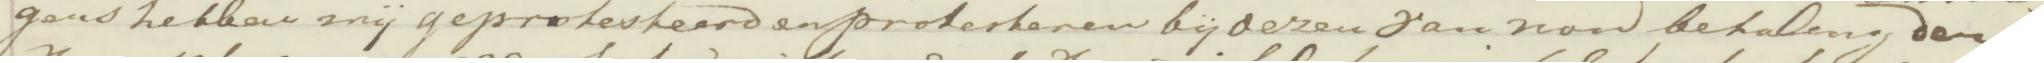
gens hebben wij geprotesteerd en protesteren bij dezen Van non betaling der
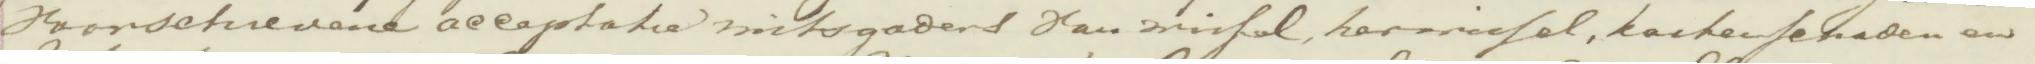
Voorschrevene acceptatie mitsgaders Van wissel, herwissel, kosten schaden en
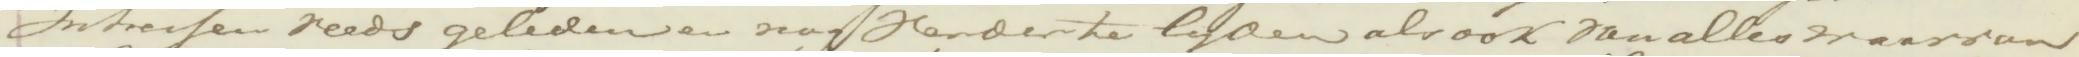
Intressen reeds geleden en nog Verder te lijden als ook van alles waarvan
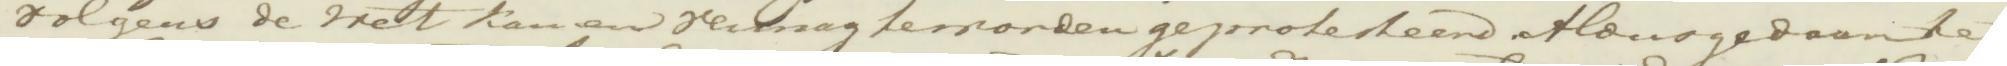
volgens de wet kan en vermag te worden geprotesteerd. Aldus gedaan te
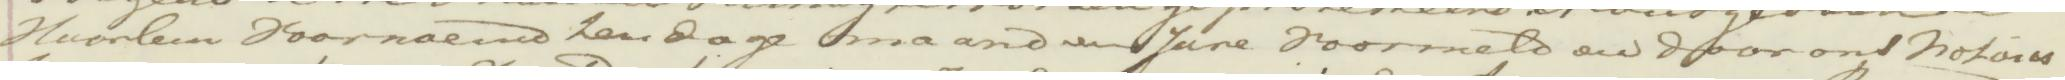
Haarlem Voornoemd ten dage maand en Jare Voormeld en door ons Notaris
